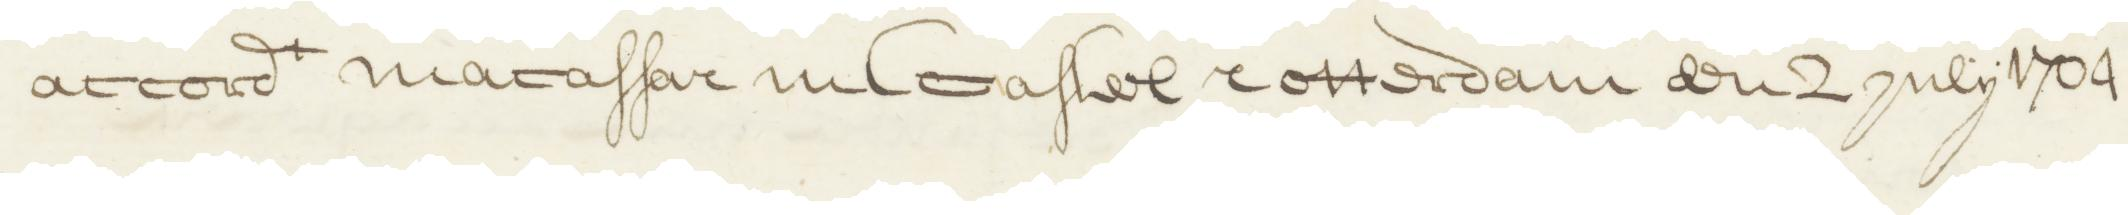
accordt macassar int casteel rotterdam den 2 julij 1704
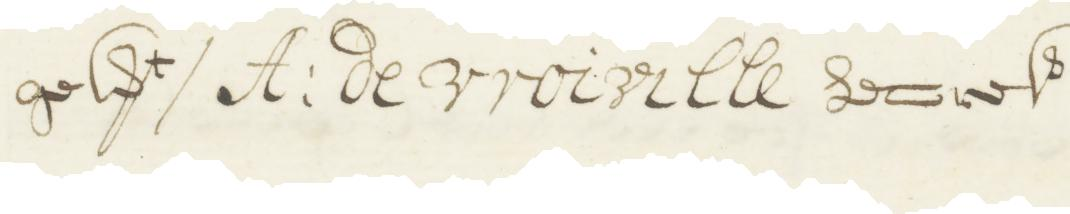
getkt/ A: de vroiville secrets
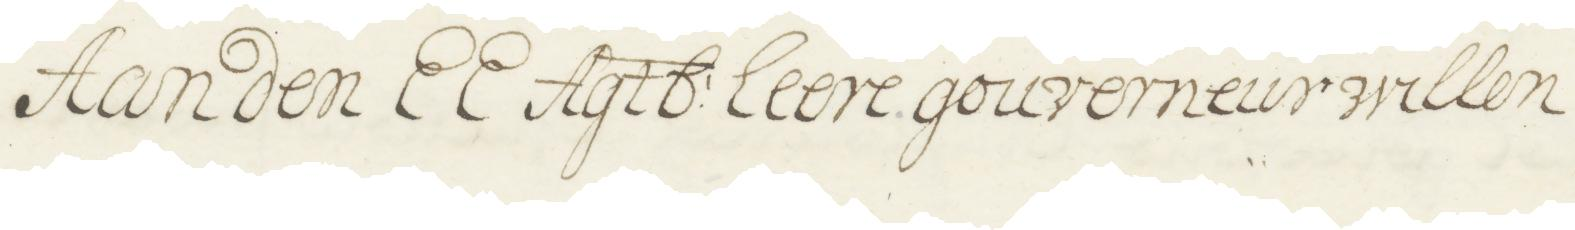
Aan den EE Agtb: heere gouverneur willen
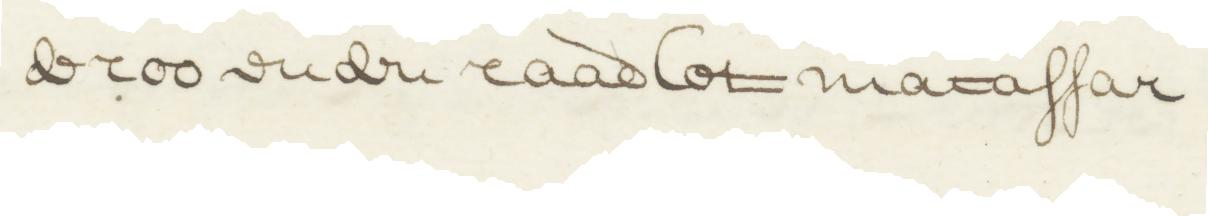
de roo en den raad tot macassar
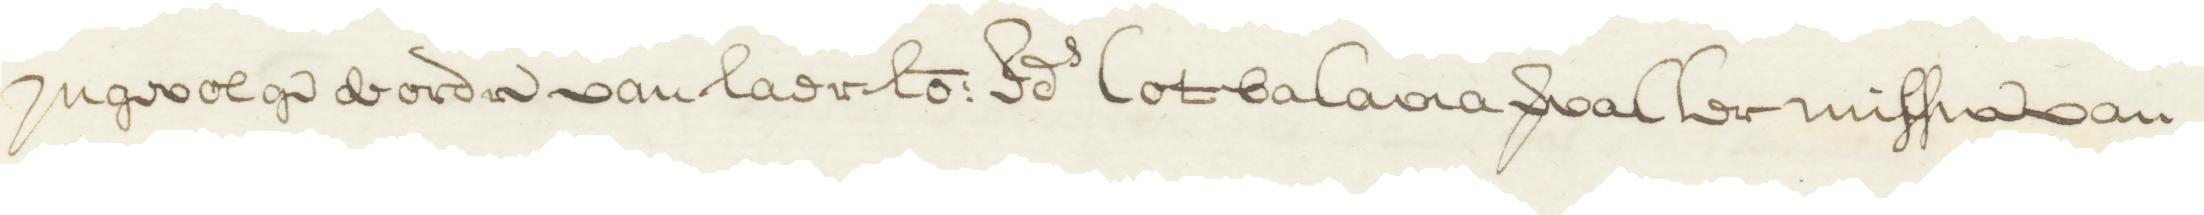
Ingevolge de ordre van haer ho: Eden tot batavia vervatter missive van
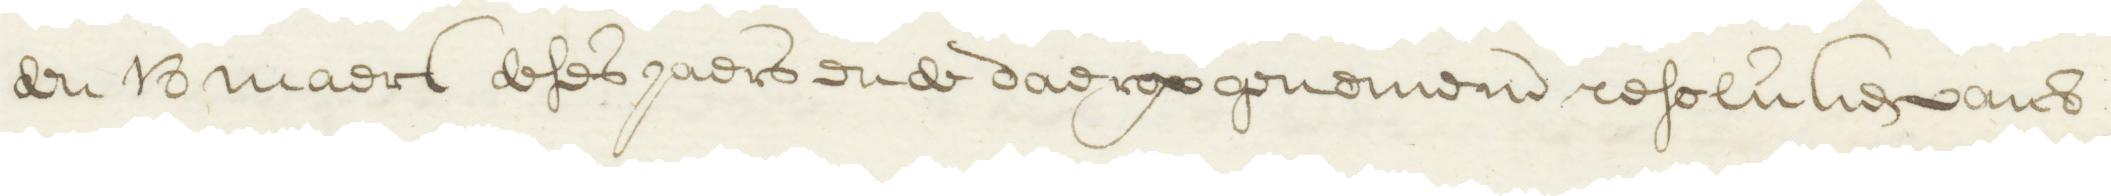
den 18 maert deses jaers ende daerop genemend resolutien van 8
